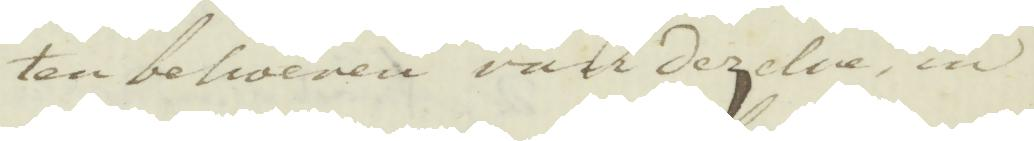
ten behoeven van dezelve, in
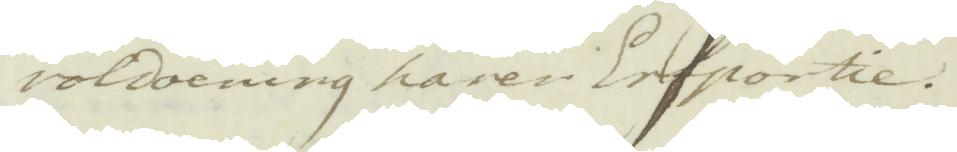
voldoening haren Erfportie.
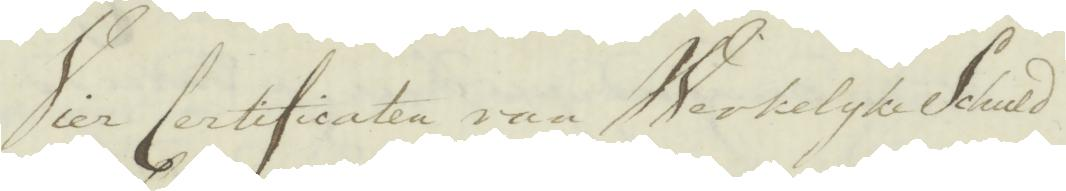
Vier Certificaten van Werkelyke Schuld
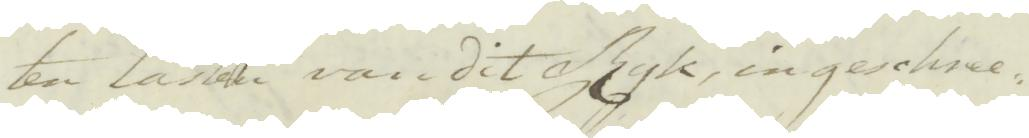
ten lasten van dit Ryk, in geschree„
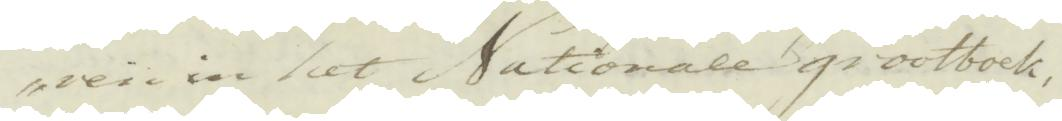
„ven in het Nationale grootboek,
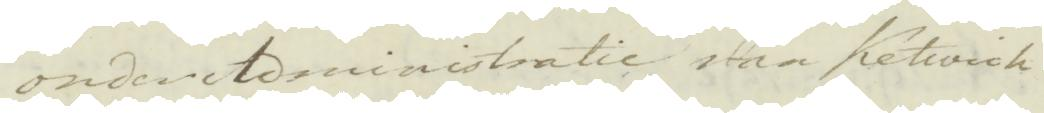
onder Administratie van Ketwick
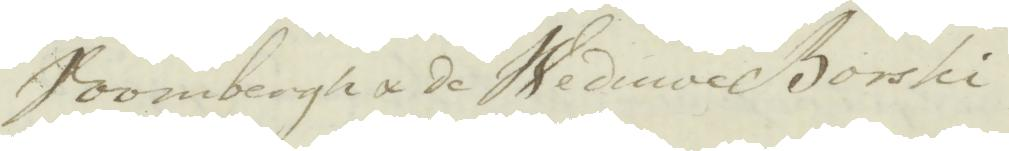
Voombergh & Weduwe Borski
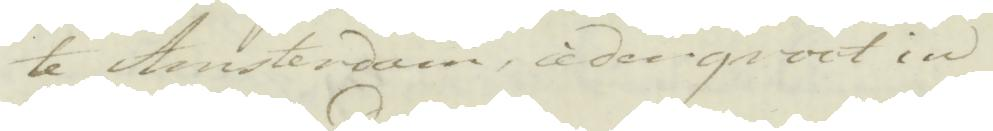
te Amsterdam, ieder groot in
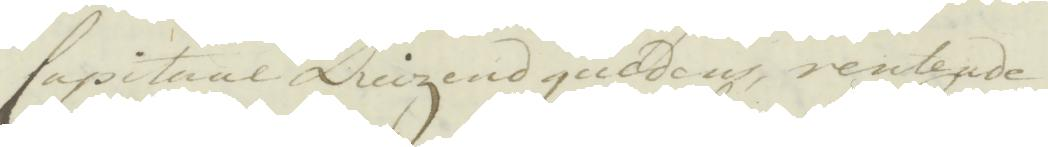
Capitaal Duizend guldens, rentende
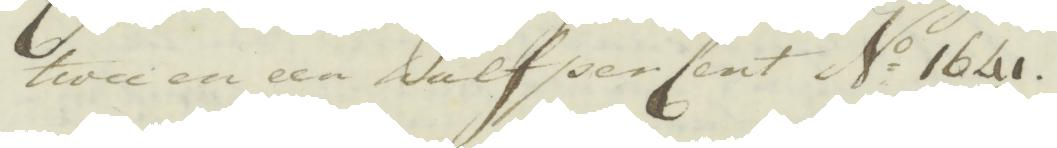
twee en een half per Cent N=o 1641.
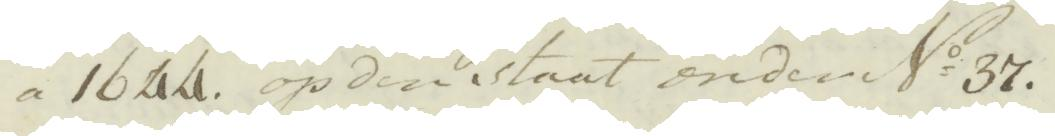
a 1644. op den slaat en de n:r 37.
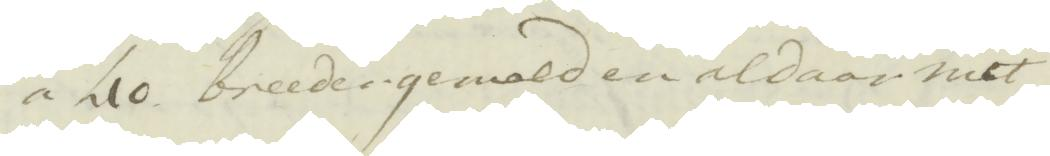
a 40. breeder gemeld en aldaar met
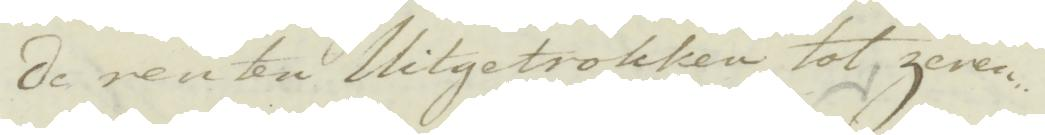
de renten Uitgetrokken tot zeven„
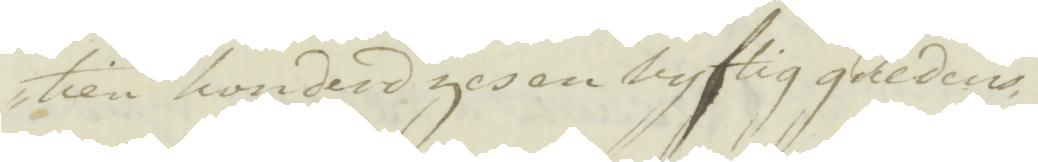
„tien honderd zeven vyftig guldens,
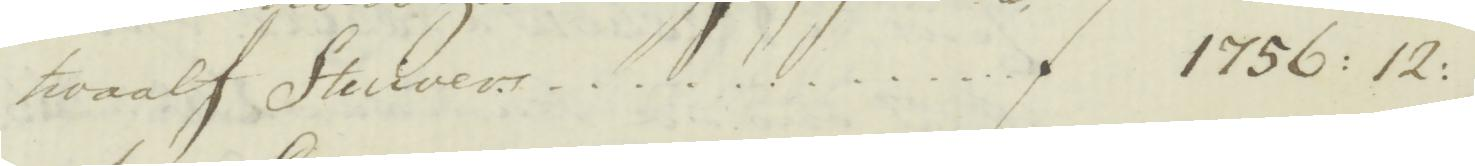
twaalf Stuivers . . . . . . . . . . . . . ƒ 1756:12: —
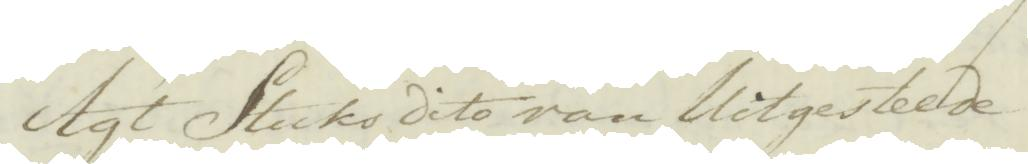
Agt Stuks dito van Uitgesteede
